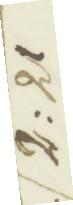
ƒ2:21
